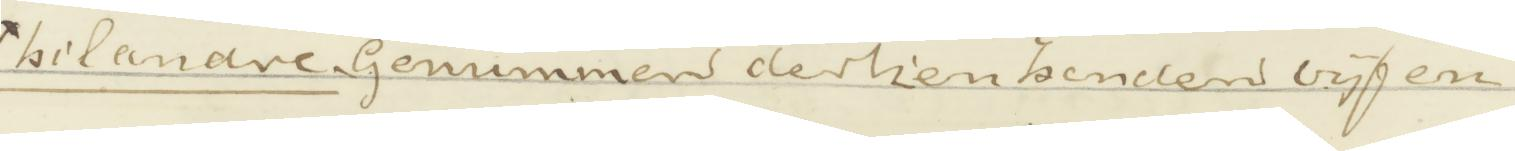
Philandre, Genummerd dertien honderd vijf en
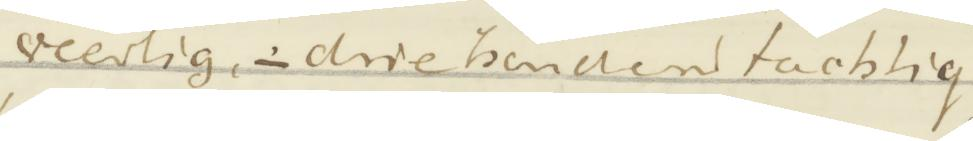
veertig. = drie honderd tachtig
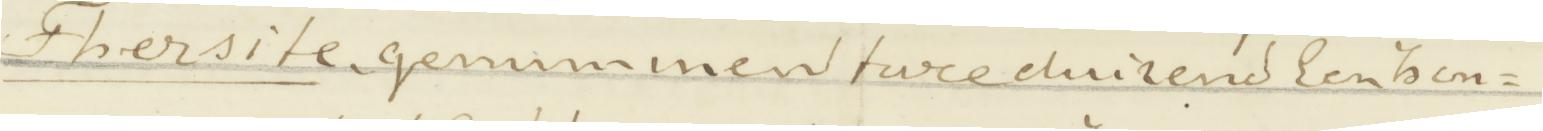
Thersite, genummerd twee duizend Een hon=
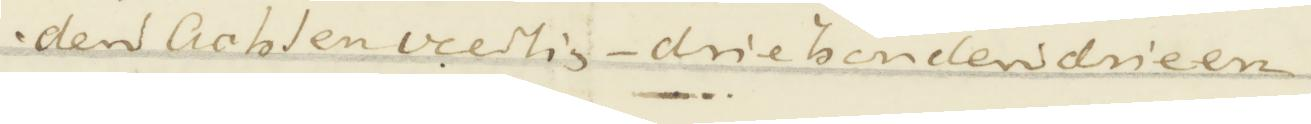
=derd Acht en veertig - drie honderd drie en
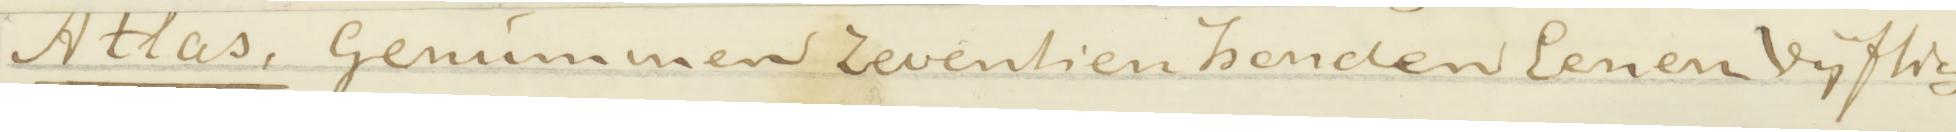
Atlas, Genummerd zeventien honderd Een en Vijftig
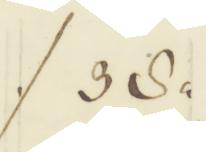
ƒ 38
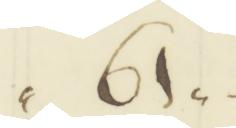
„ 61„
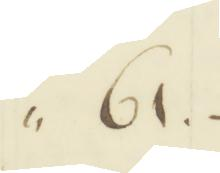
„ 61.
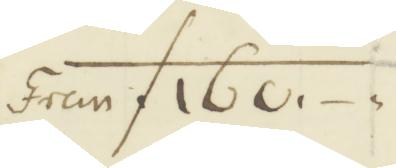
Tran ƒ160.—„
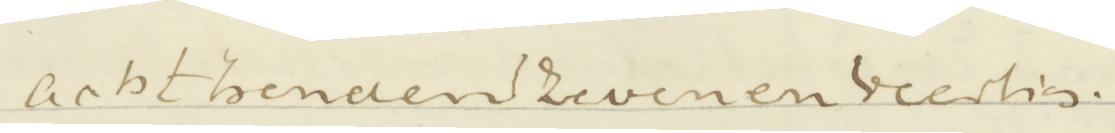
Achthonderd zeven en veertig.
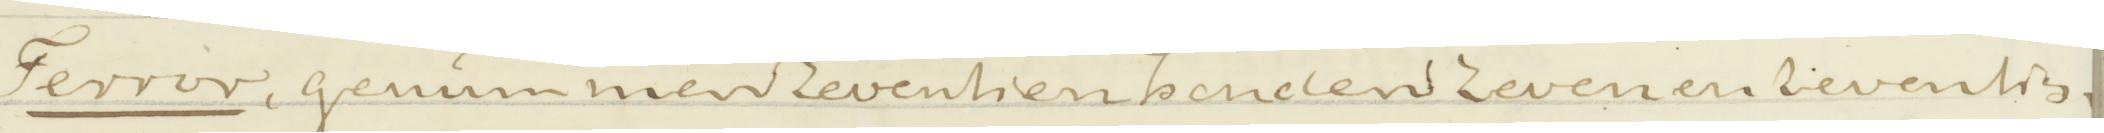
Terror, genummerd zeventien honderd zeven en zeventig
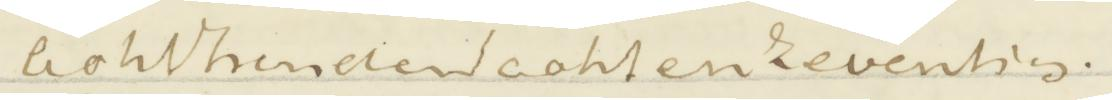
Achthonderd acht en zeventig.
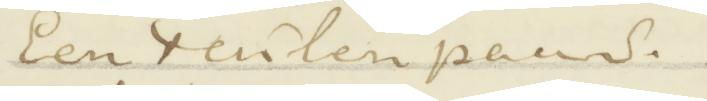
Een veulen paard.
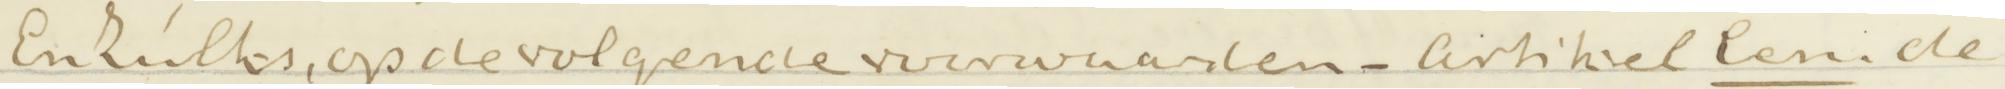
En zulks, op de volgende voorwaarden - Artikel Een de
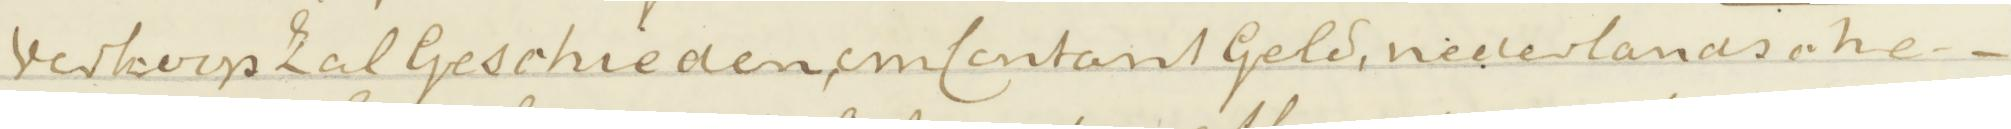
verkoop zal Geschieden, om Contant Geld, nederlandsche-
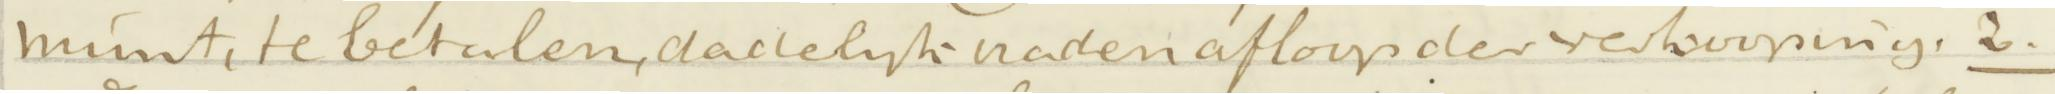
munt, te betalen, dadelyk naden afloop der verkooping. 2.
